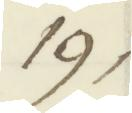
19,
